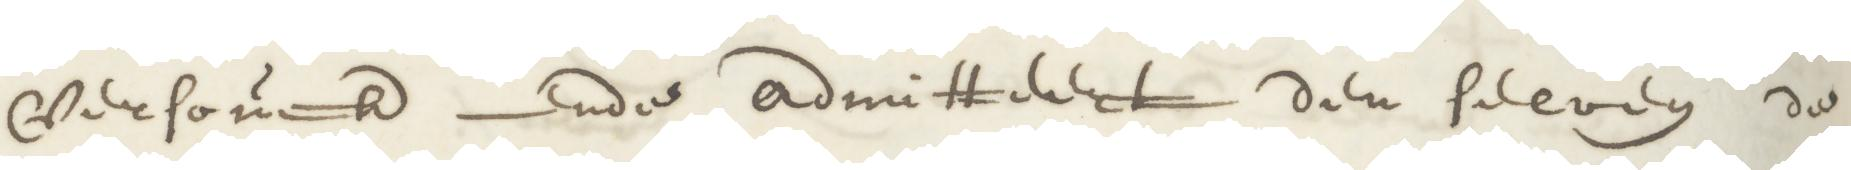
versouck ende admitteert den selven de
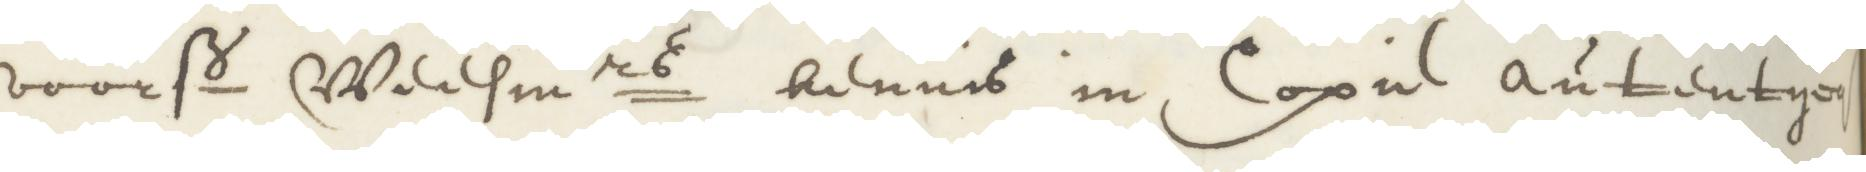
voors-s weesm=rs kennis in Copie autentijcq
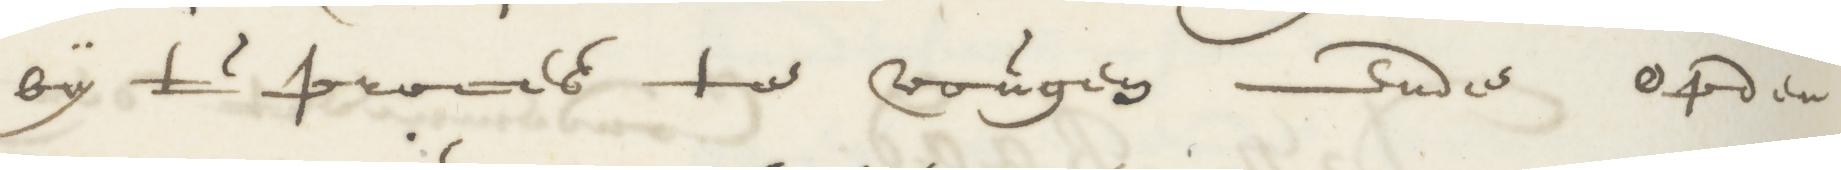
bij t' proces te vougen Ende opden
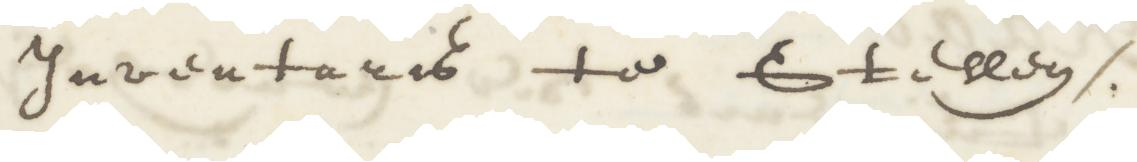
Jnvertaris te stellen/.
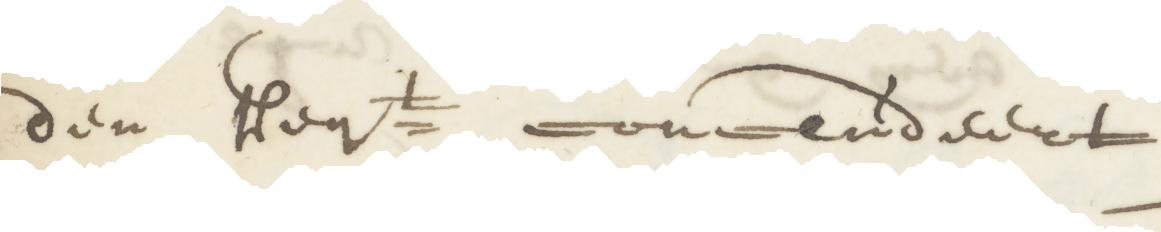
den Req=t concludeert
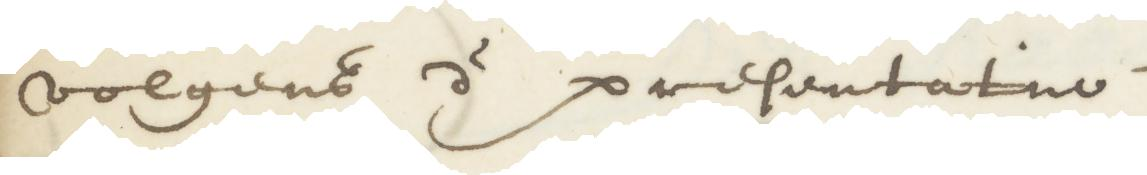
volgens d’ presentatie
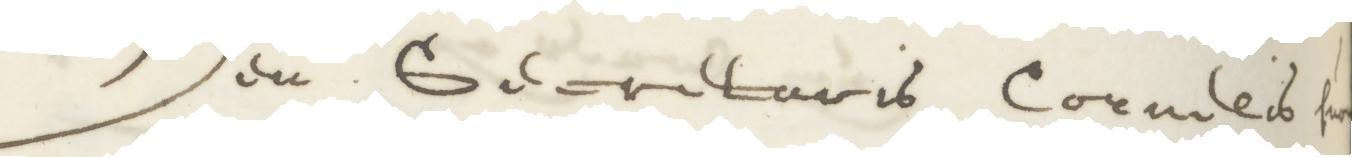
Den Secretaris Cornelis s
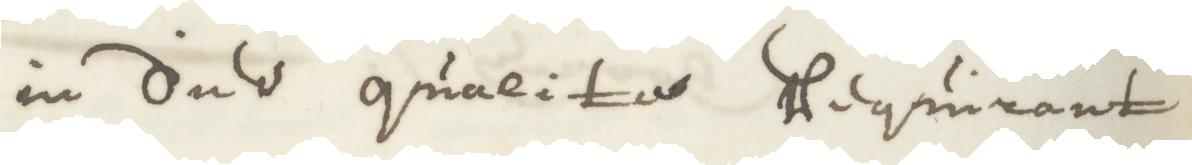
in dies qualite Requirant
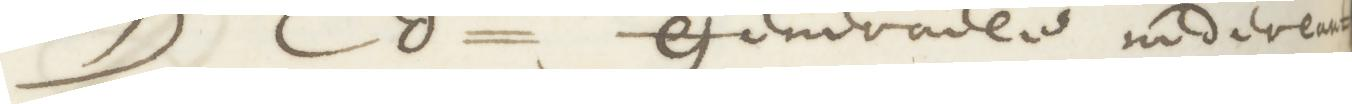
D' Ed=le generaele nederlant
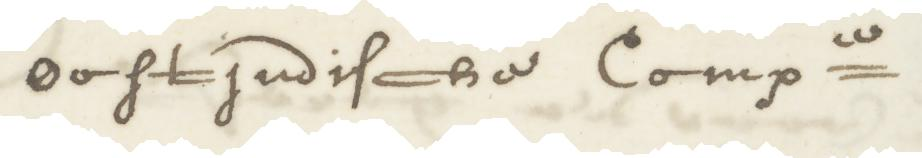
oost jndische Comp=e
